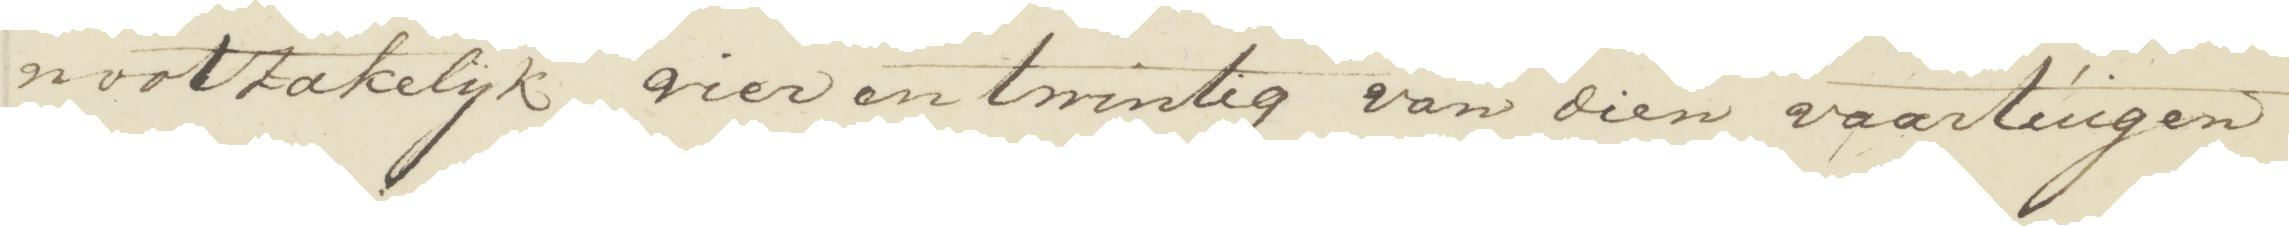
nootzakelijk vier en twintig van dien vaartuigen
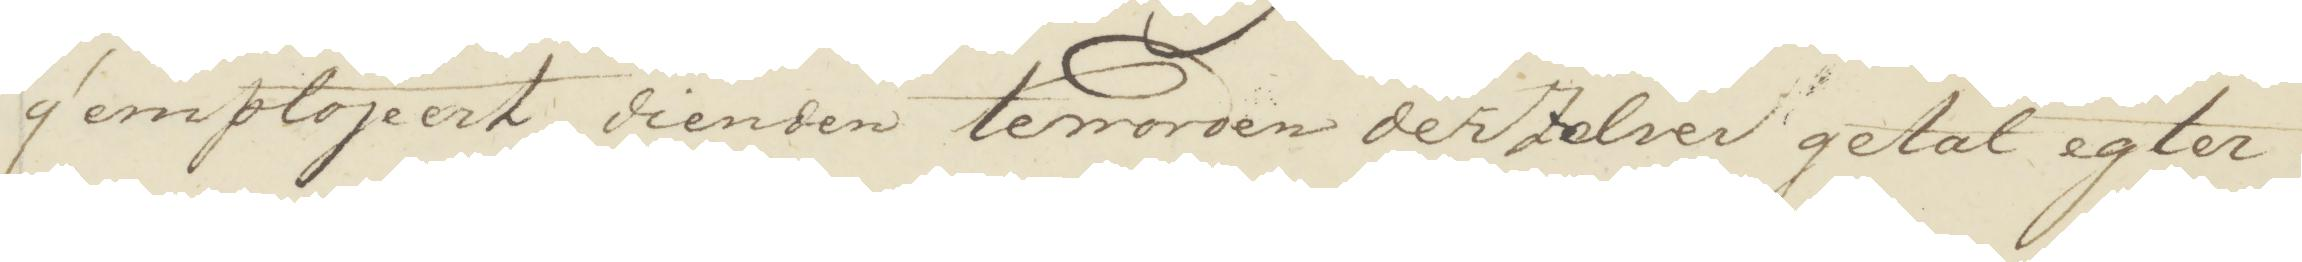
g'emplojeert dienden te worden der zelver getal egter
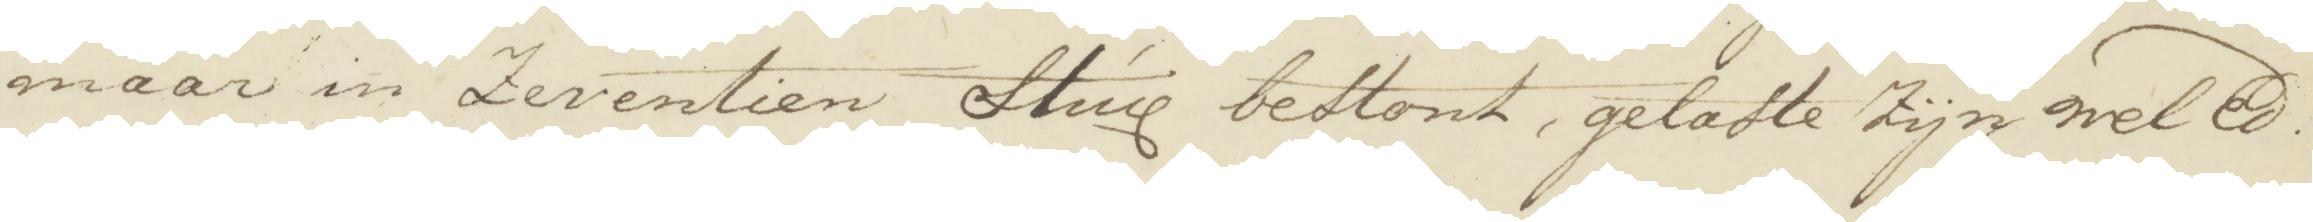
maar in zeventien Stux bestont, gelaste Zijn wel Ed:
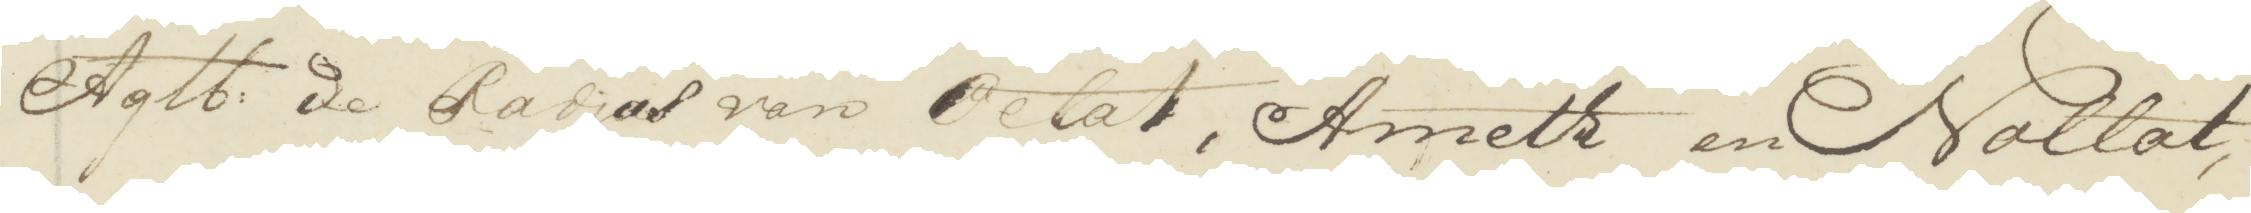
Agtb: de Radjas van Oelat, Ameth en Nollot,
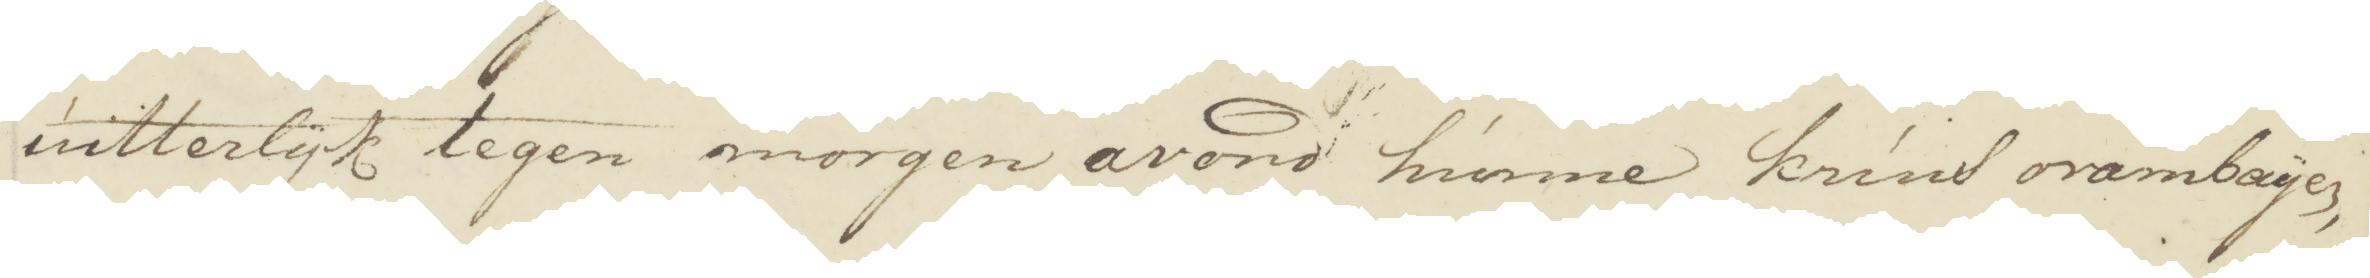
uitterlijk tegen morgen avond hunne kruis orambaijen,
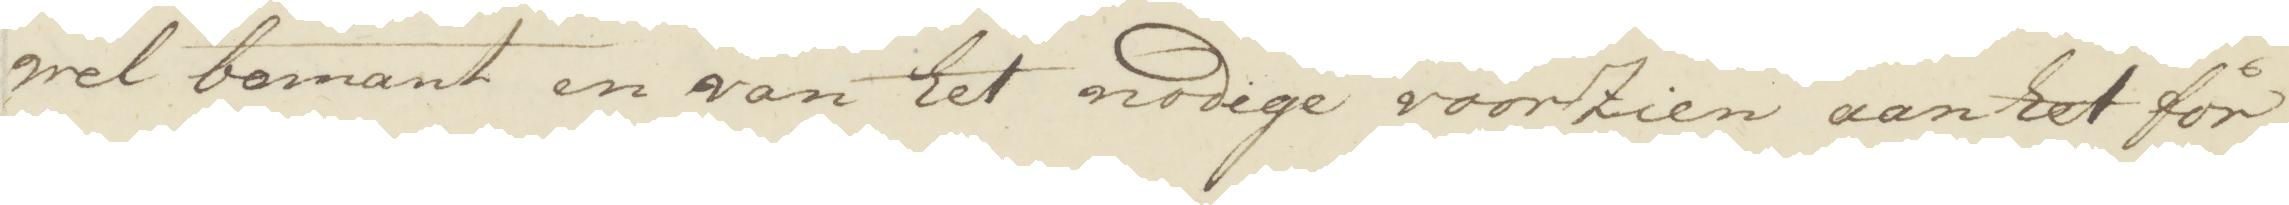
wel bemant en van het nodige voorzien aan het for
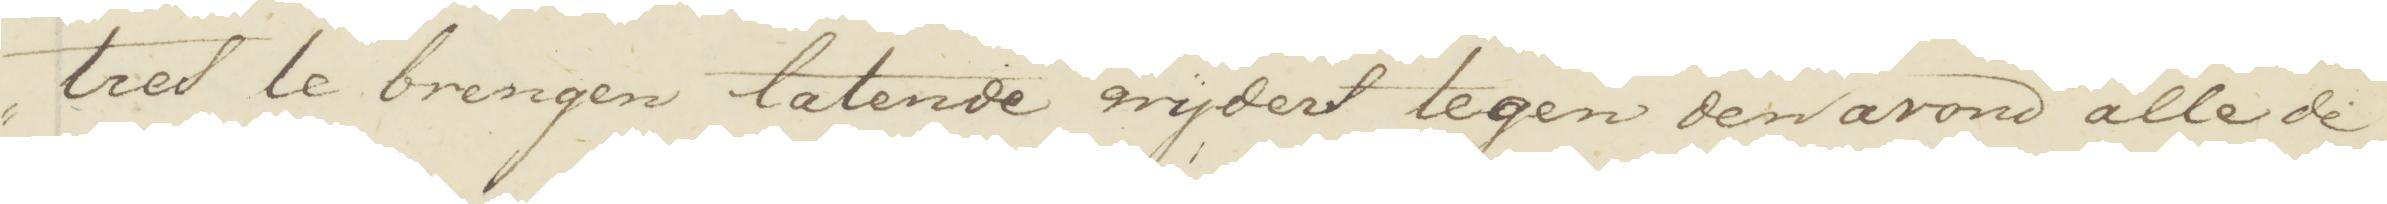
tres te brengen latende wijders tegen den avond alle de
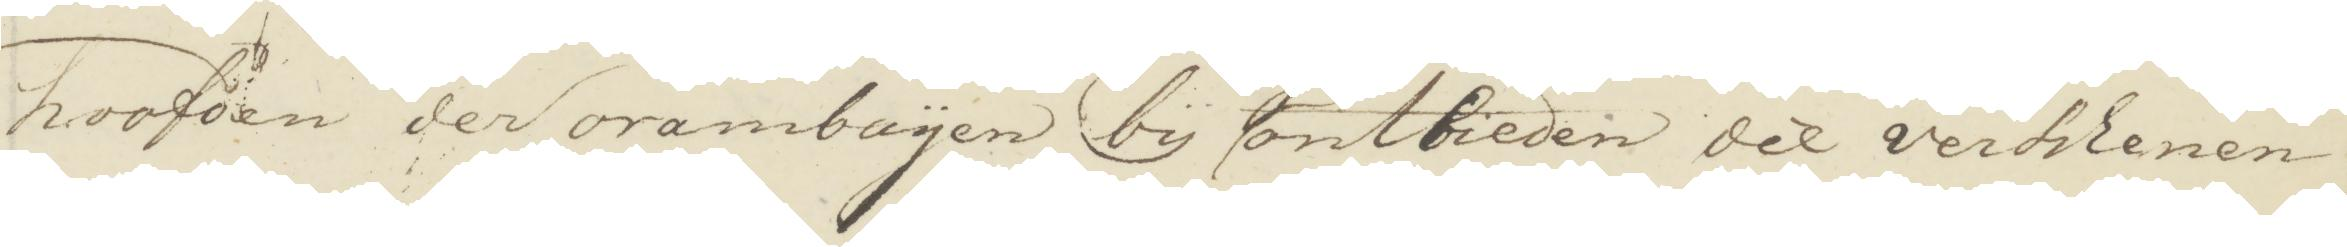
hoofden der orambaijen bij ^ ontbieden die verschenen
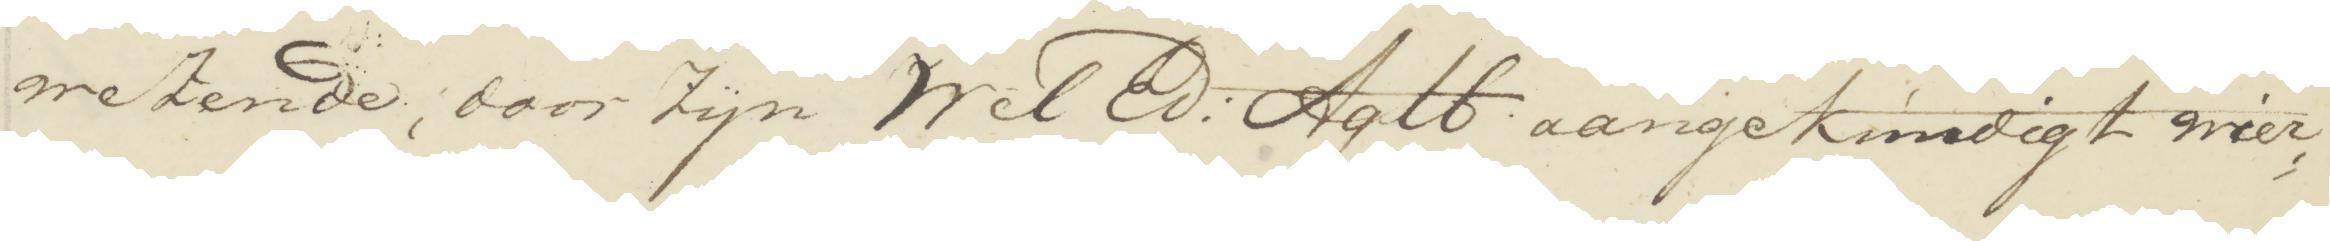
wezende, door Zijn Wel Ed: Agtb: aangekundigt wier„
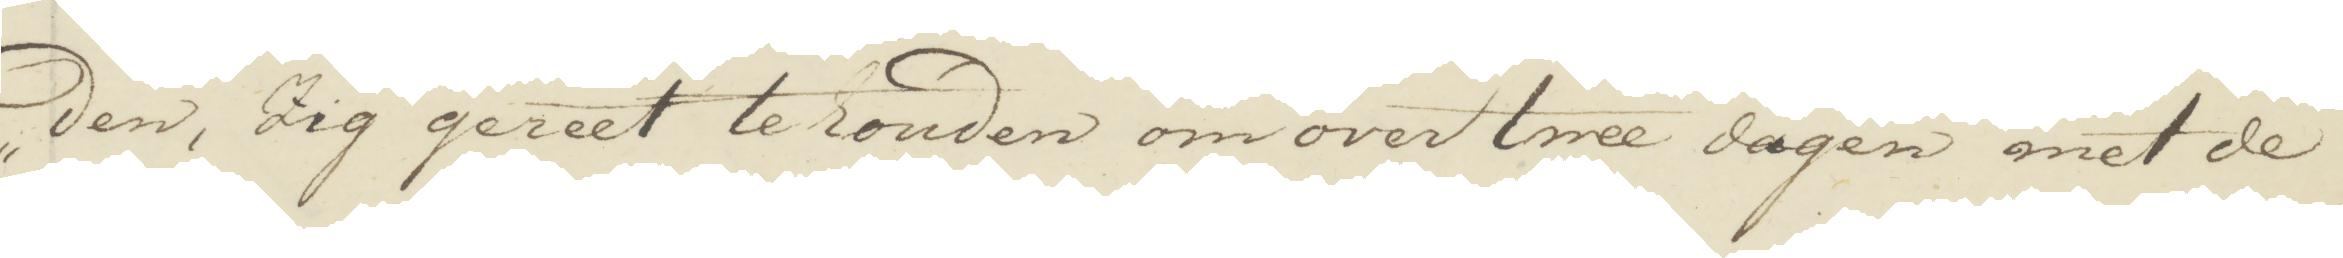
„den, Zig gereet te houden om over twee dagen met de
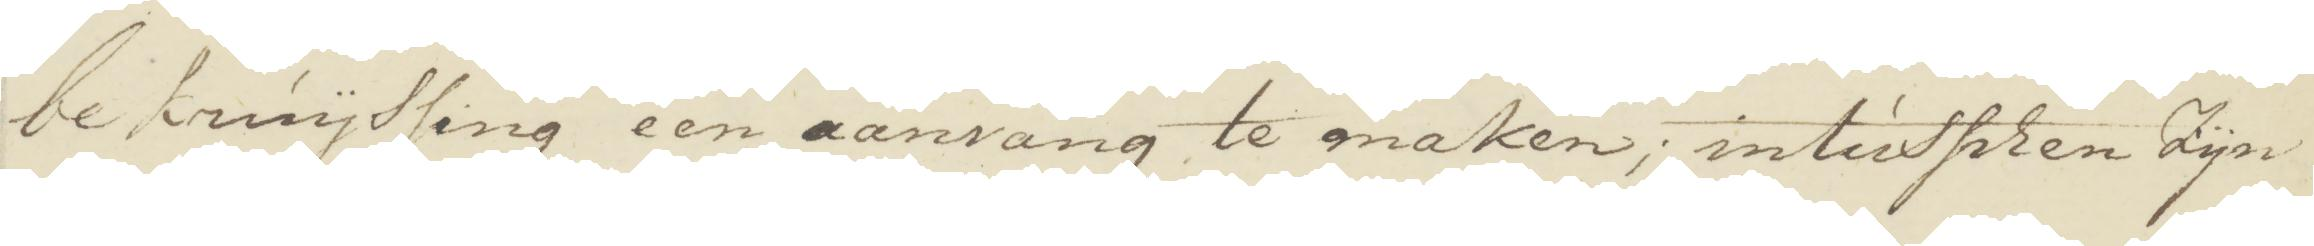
bekruijssing een aanvang te maken; intusschen Zijn
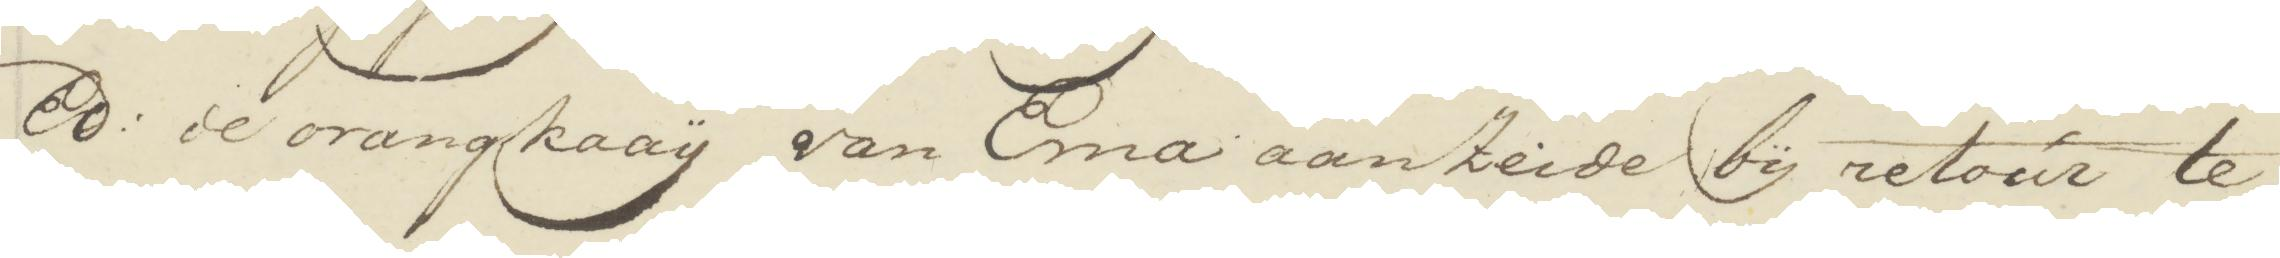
Ed: de orangkaaij van Ema aanzeide bij retour te
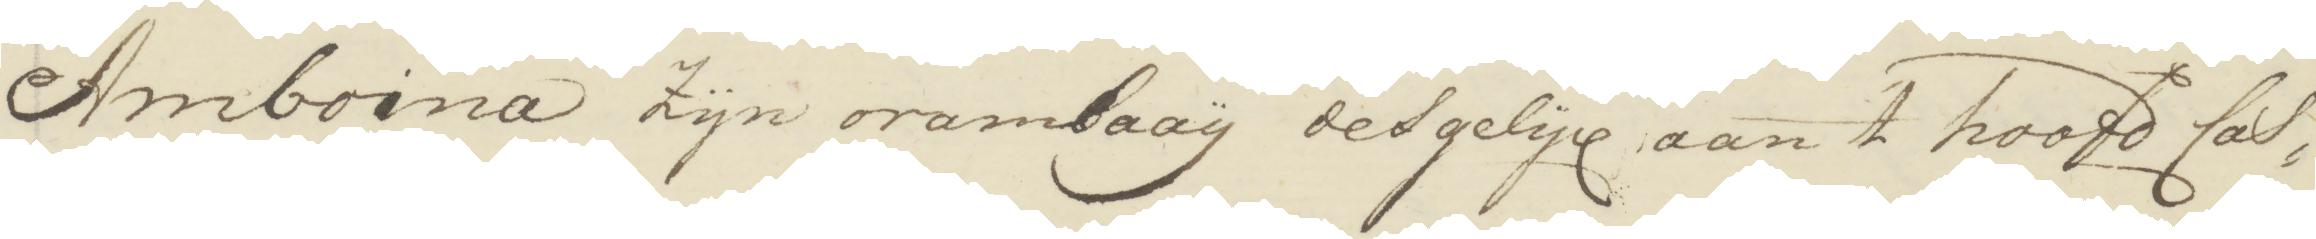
Amboina Zijn orambaaij des gelijx aan ’t hoofd Cas„
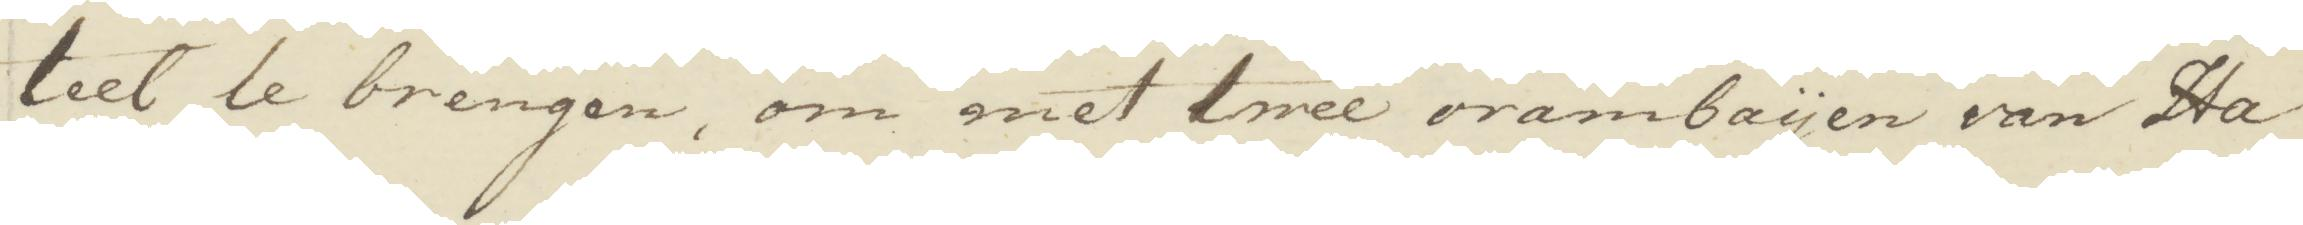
teel te brengen, om met twee orambaijen van Ha„
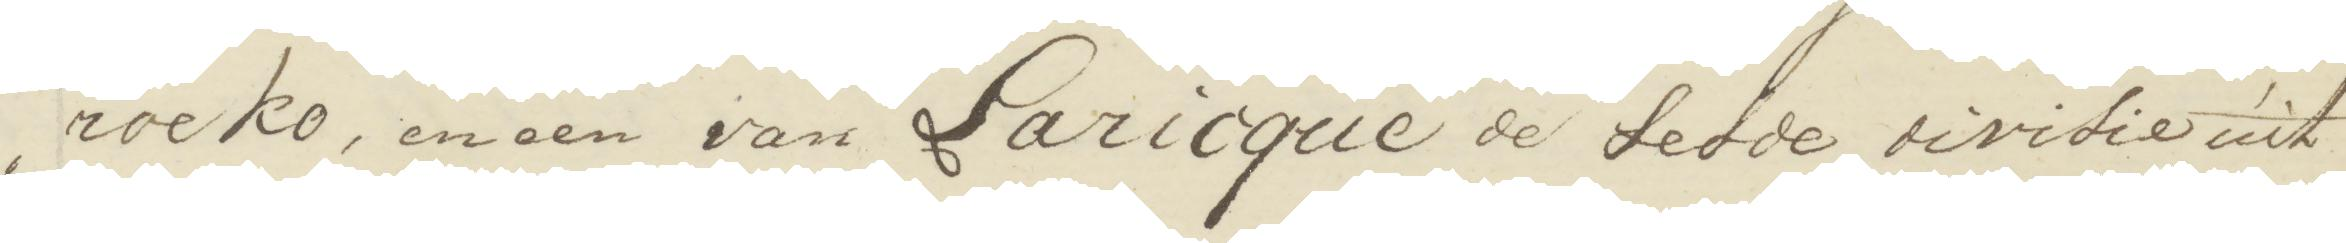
„roeko, en een van Laricque de sesde divisie uit
